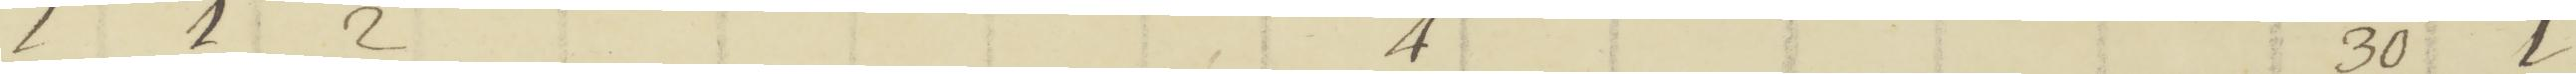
1 1 2 4 30 1
